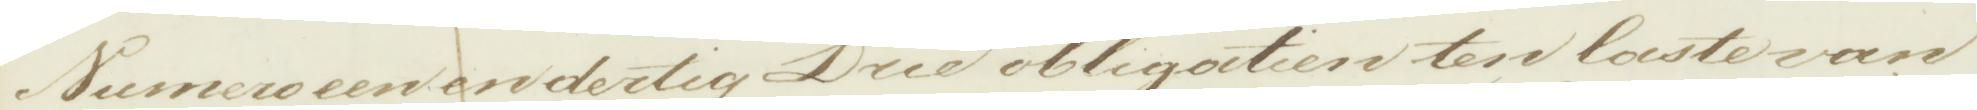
Numero een en dertig Drie obligatien ten laste van
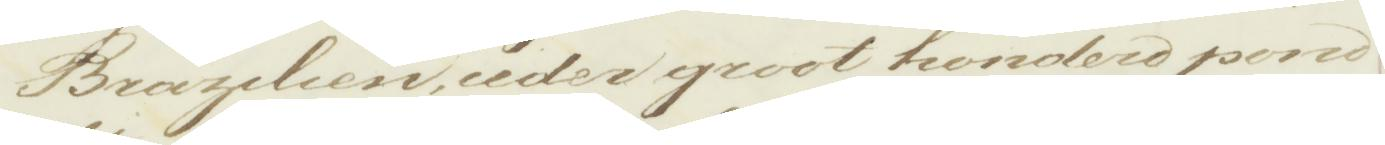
Brazilien, ieder groot honderd pond
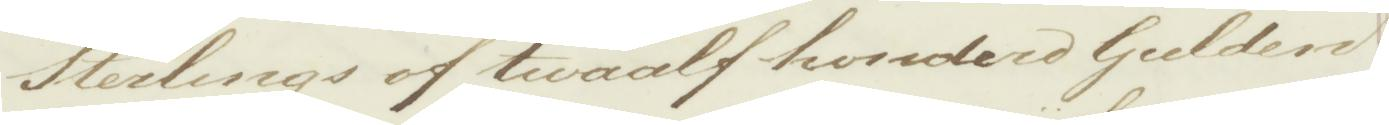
sterlings of twaalf honderd Gulden
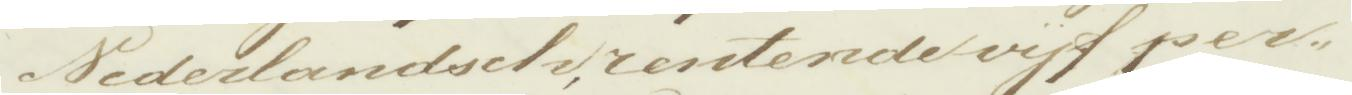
Nederlandsch, rentende vijf per„
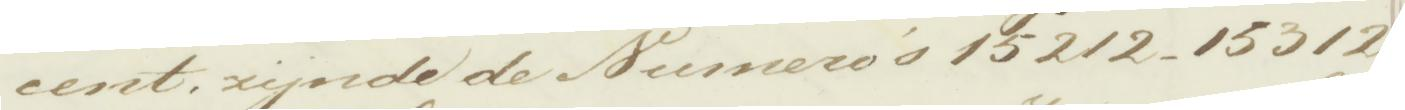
cent, zijnde de Numero's 15212- 15312
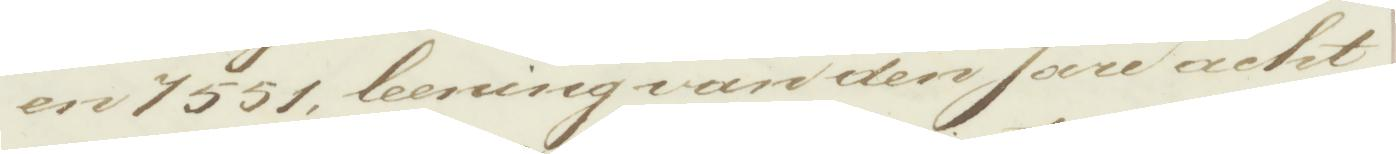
en 7551, leening van den Jare acht
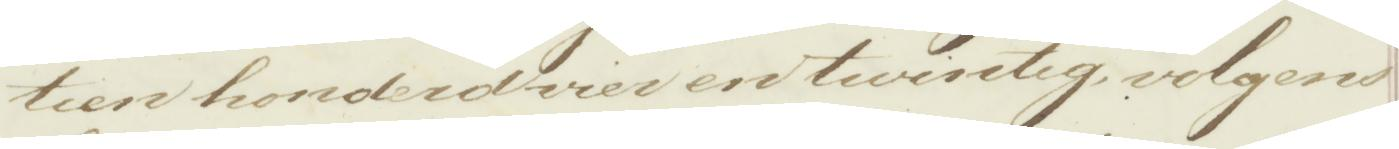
tien honderd vier en twintig, volgens
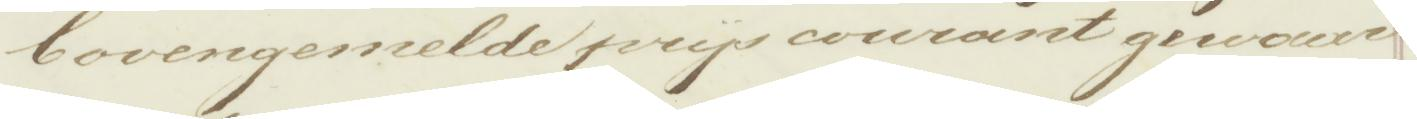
bovengemelde prijs courant gewaar
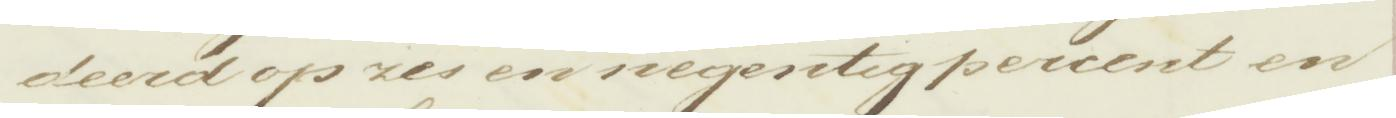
deerd op zes en negentig percent en
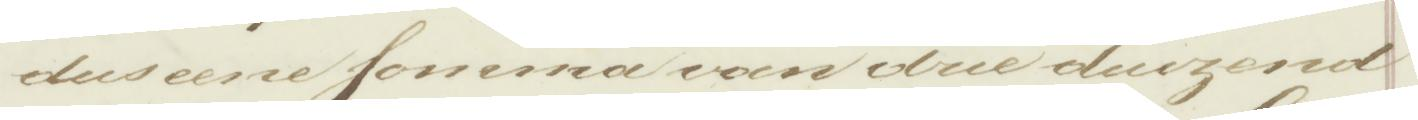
dus eene somma van drie duizend
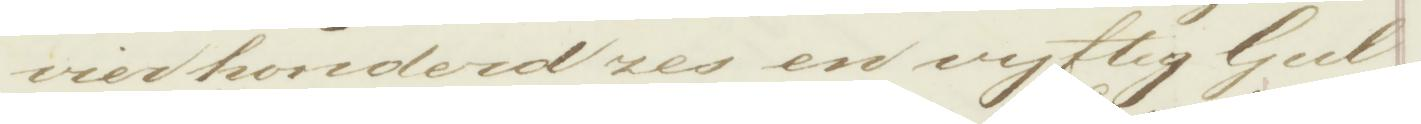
vier honderd zes en vyftig Gul
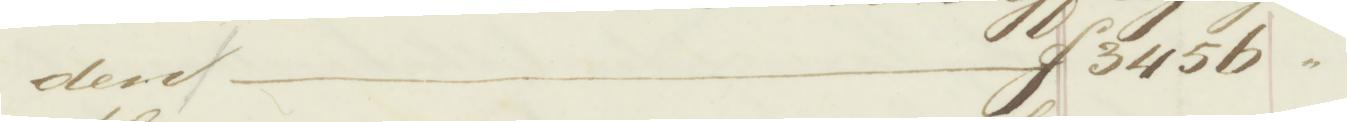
den — ƒ 3456 „
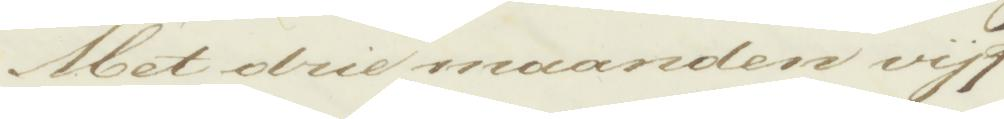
Met drie maanden vijf
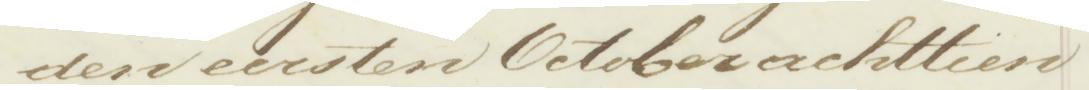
den eersten October achttien
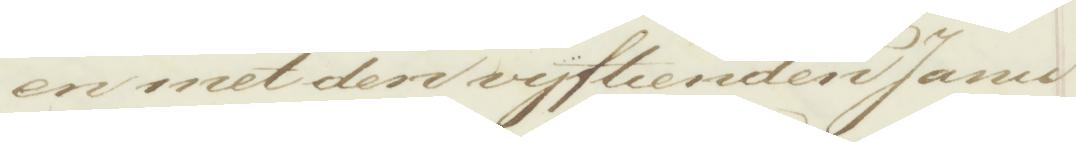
en met den vijftienden Janu
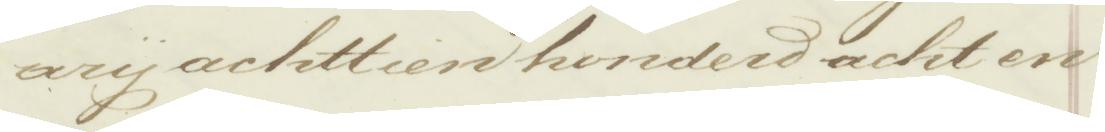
arij achttien honderd acht en
